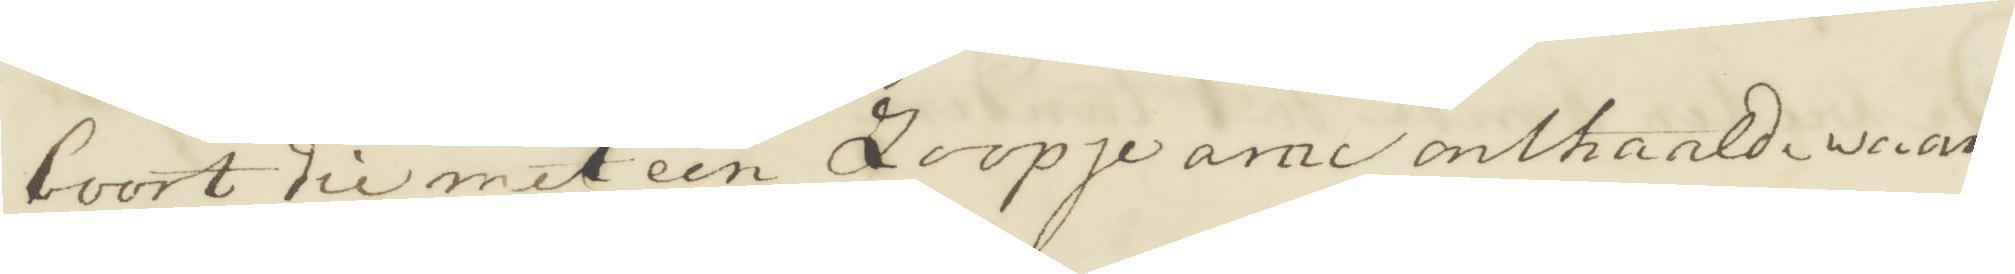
boort die met een Zoopje arac onthaalde waar
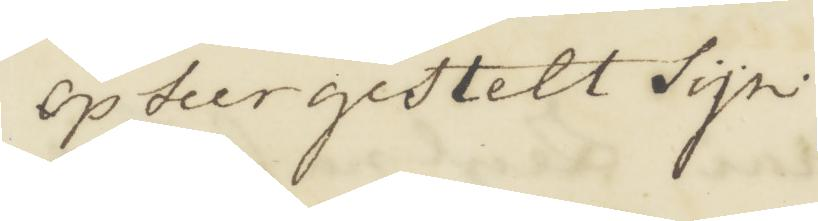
op seer gestelt sijn
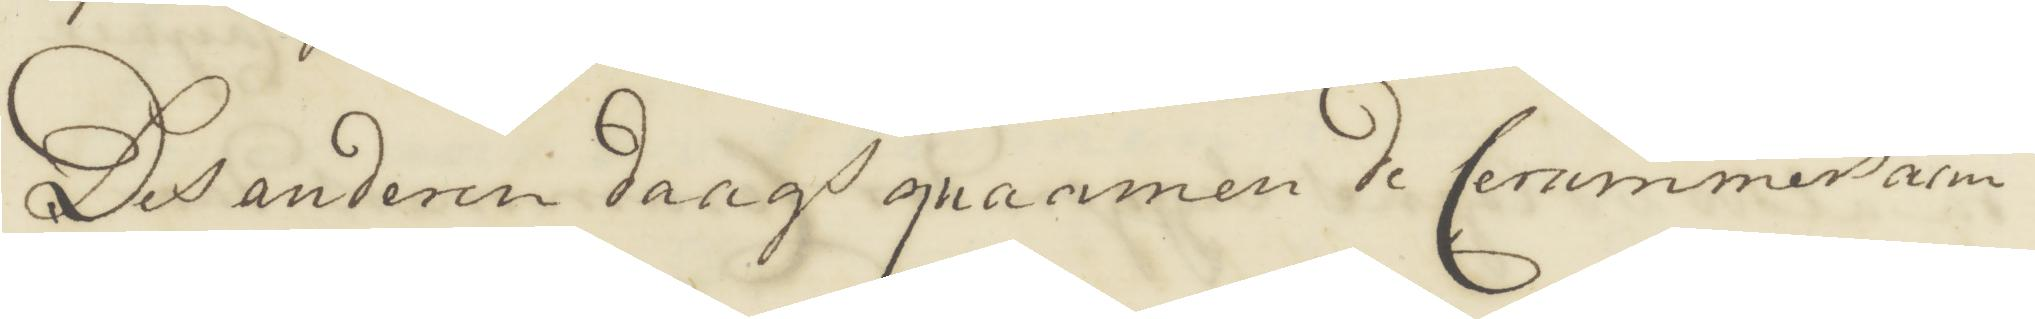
Des anderen daags quaamen de cerammers aan
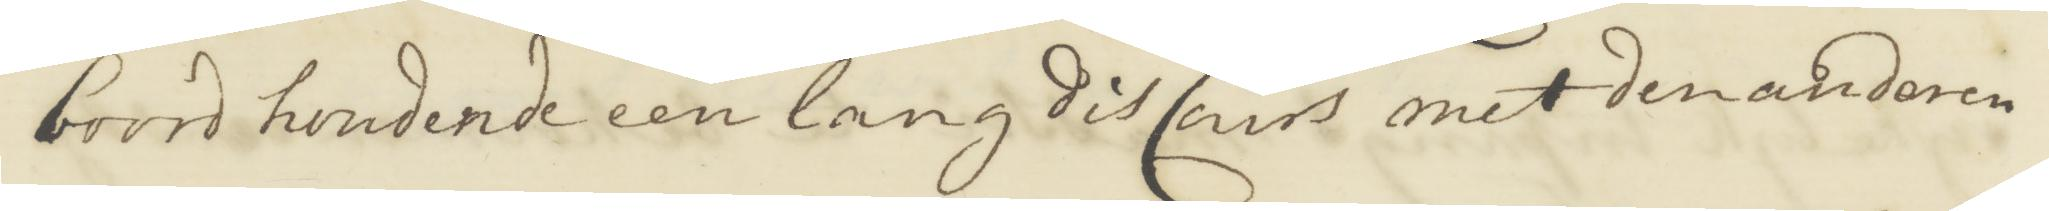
boord houdende een lang discours met den anderen
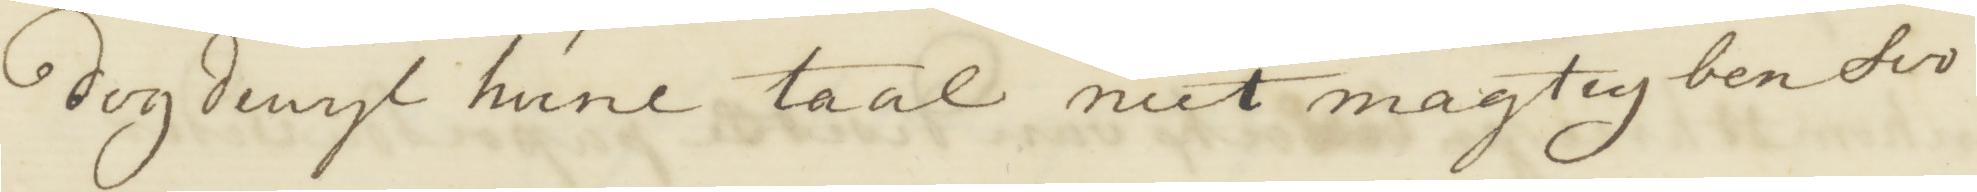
dog dewijl hune taal niet magtig ben soo
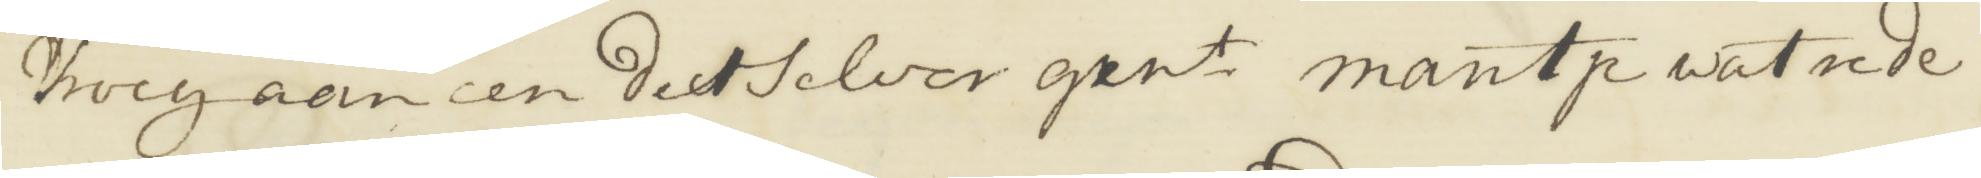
vroeg aan een detselver gen=t mantje wat rede
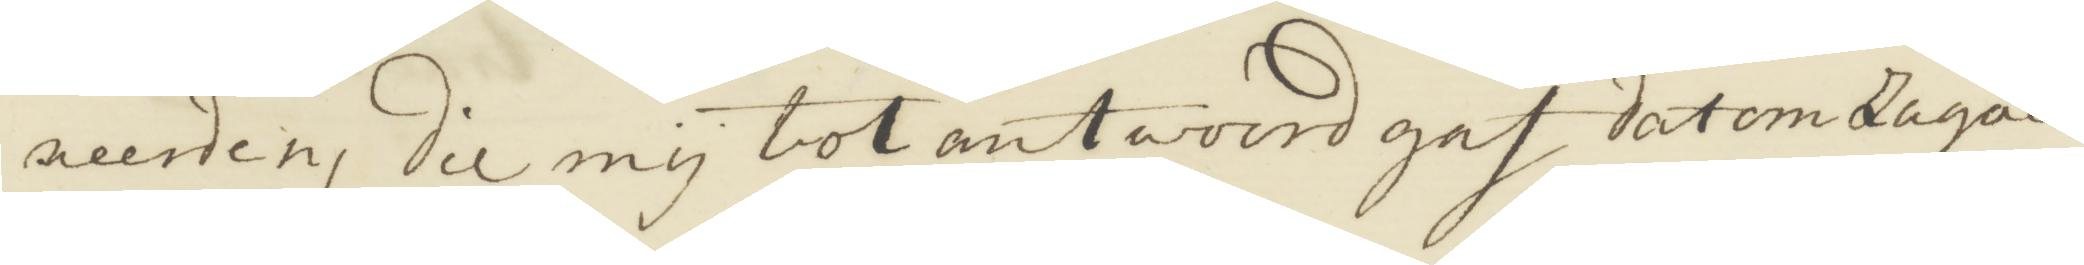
neerden, die mij tot antwoord gaf dat om zagoe
